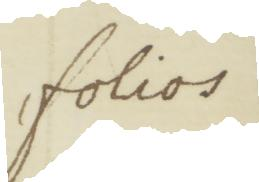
folios
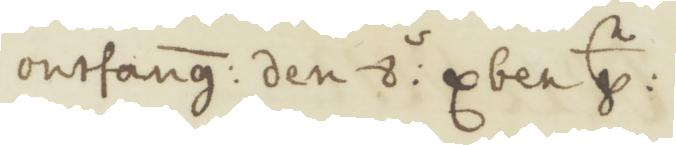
ontfang: den 8:e xber p:r
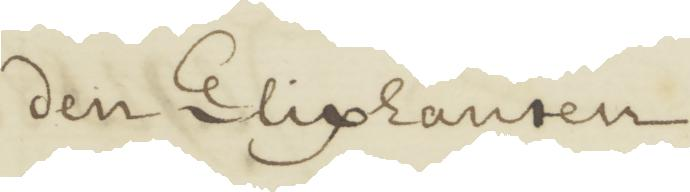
den Eliphanten
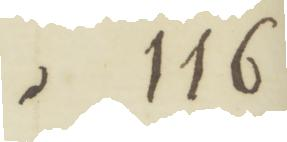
„ 116
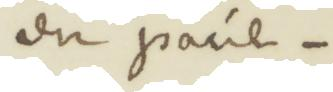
en paul -
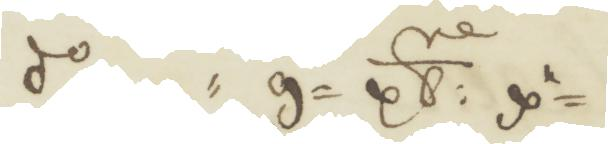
do: „ 9=e xb:re p=r
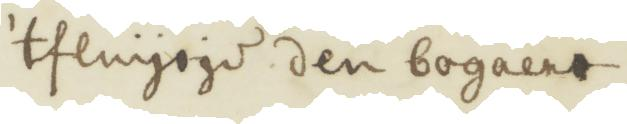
'tfluijtje den bogaert
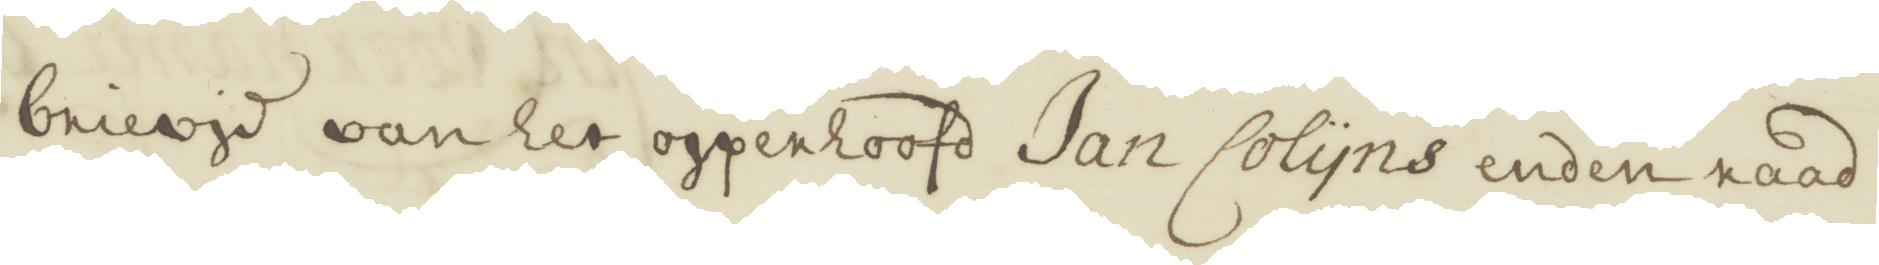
brievje van het opperhoofd Ian Colijns enden raad
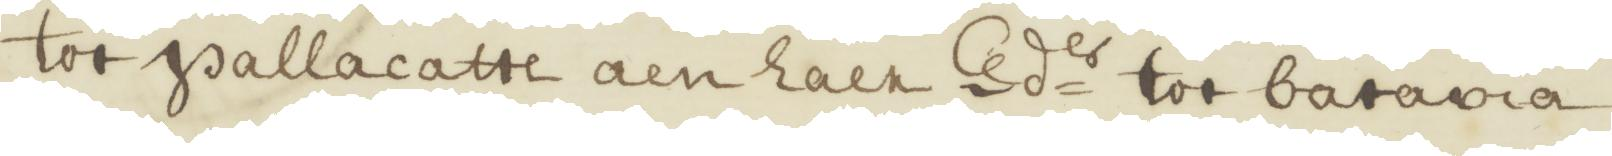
tot pallacatte aen haer Ed=ls tot batavia
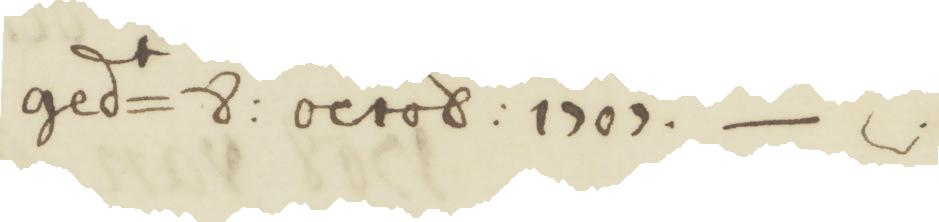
ged=t 8:e octob:r 1707. — .
